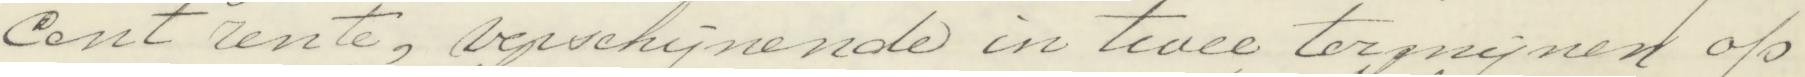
cent rente, verschijnende in twee termijnen op
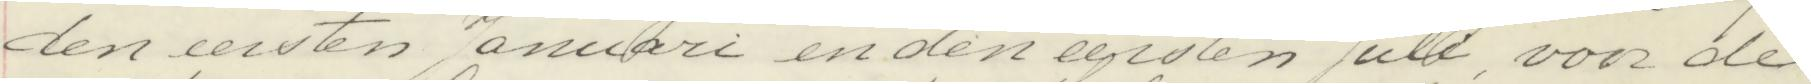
den eersten Januari en den eersten Juli, voor de
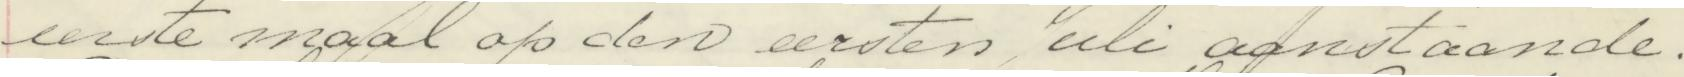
eerste maal op den eersten Juli aanstaande
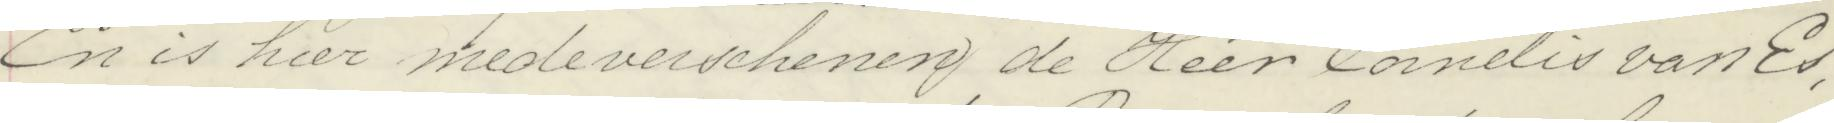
En is hier mede verschenen de Heer Conelis van Es,
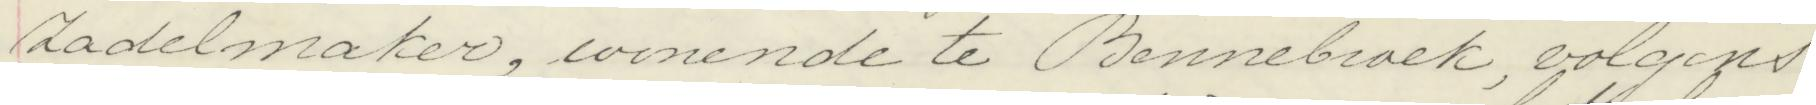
zadelmaker, wonende te Bennebroek, volgens
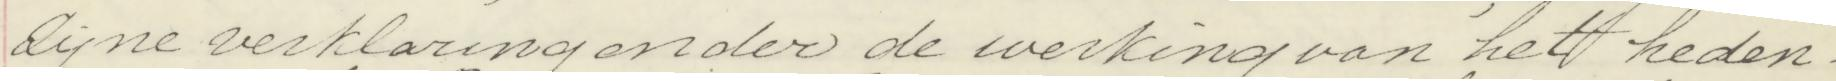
zijne verklaring onder de werking van het heden
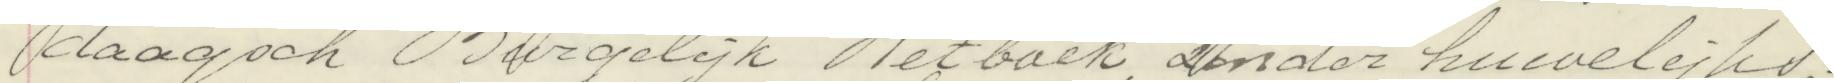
daagsch Burgelijk Wetboek zonder huwelijks
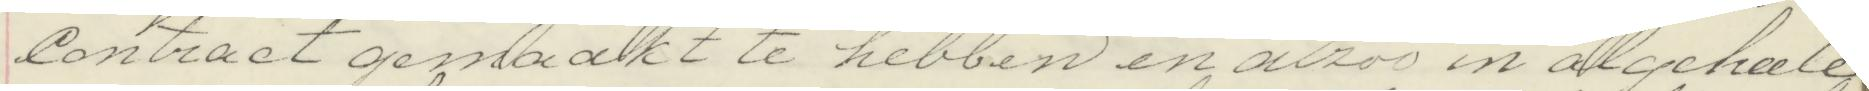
Contract gemaakt te hebben en alzoo in algeheele
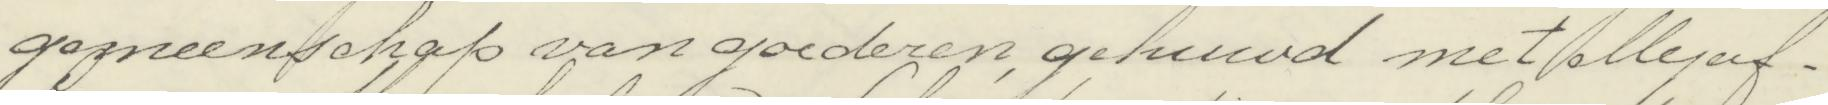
gemeenschap van goederen, gehuwd met Mejuf-
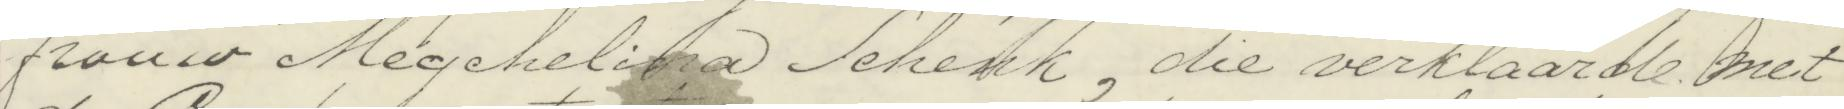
frouw Megchelina Schenk, die verklaarde met
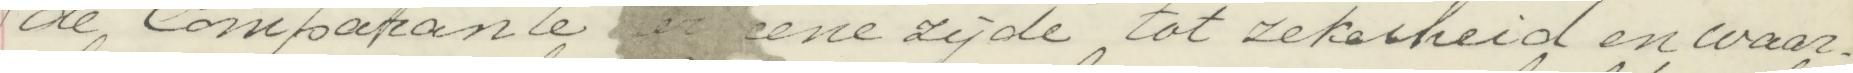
de Comparante ter eene zijde tot zekerheid en waar
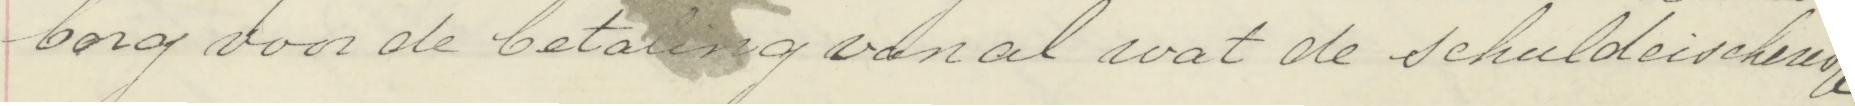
borg voor de betaling van al wat de schuldeischeresse
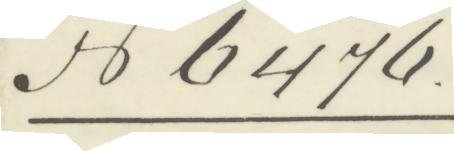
N=o 6476.
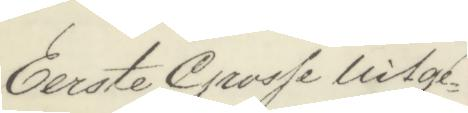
Eerste Grosse uitge=
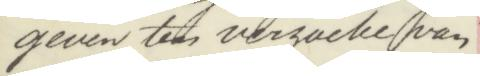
geven ten verzoeke van
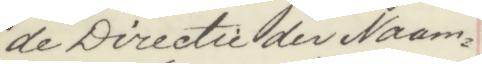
de Directie der Naam=
